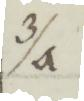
¾
